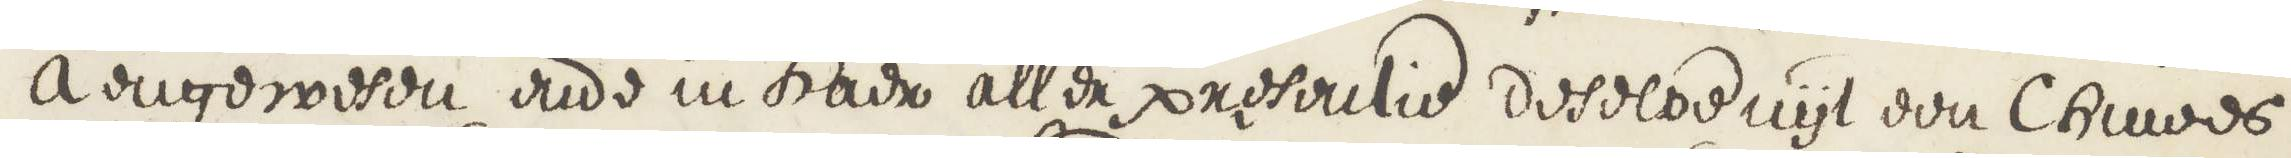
aengewesen ende in haer aller presentie deselve uijt een Chinees
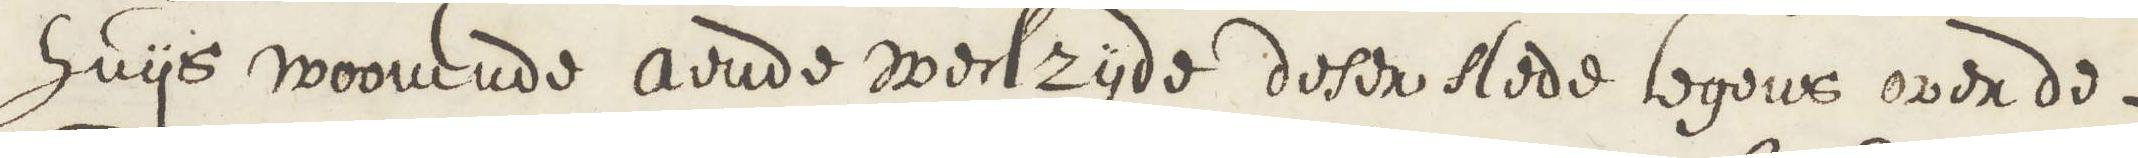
huijs woonende aende westzijde deser stede tegens over de
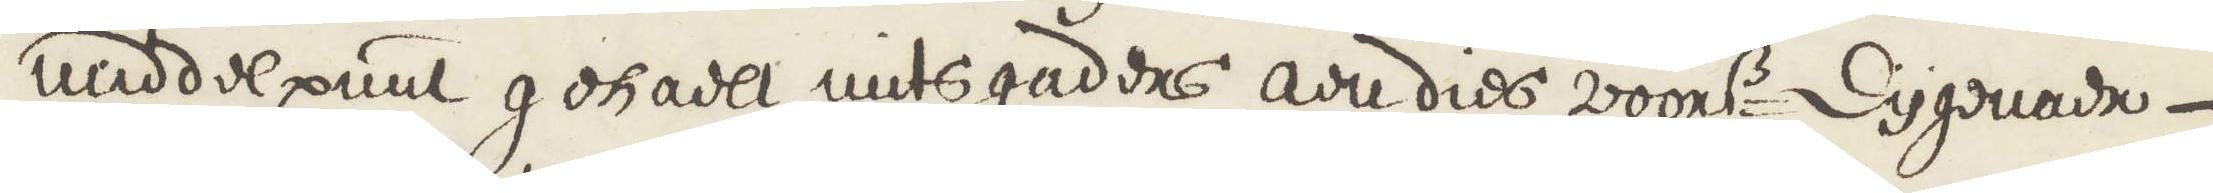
middelpunt gehaelt mitsgaders aen dies voors=z Eijgenaer —
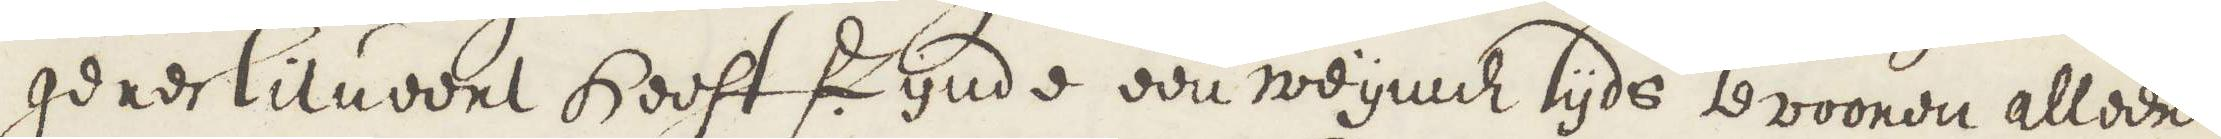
gerestitueert heeft Zijnde een weijnich tijds te vooren alleer
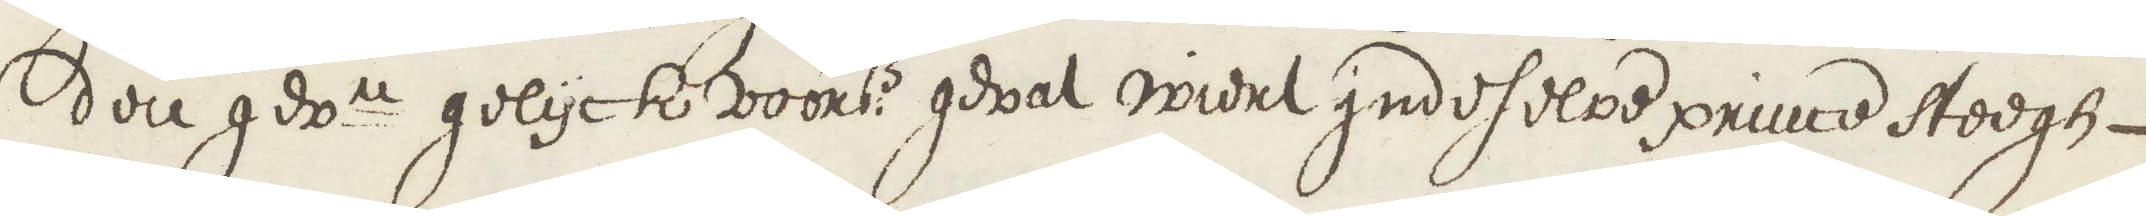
den gev=n gelijck voors:z geval wiert jndeselve prince steegh —
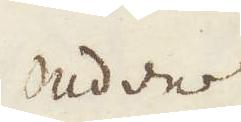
Ondere
